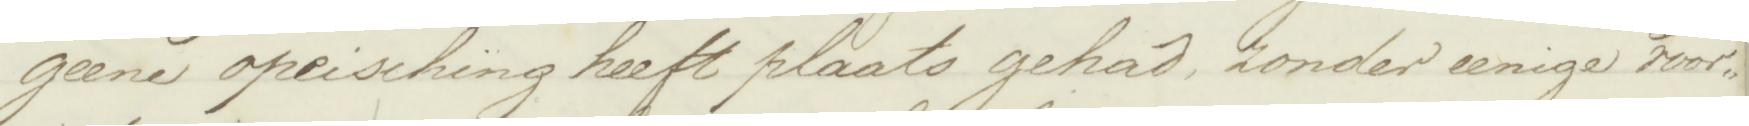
geene opeisching heeft plaats gehad, zonder eenige voor„
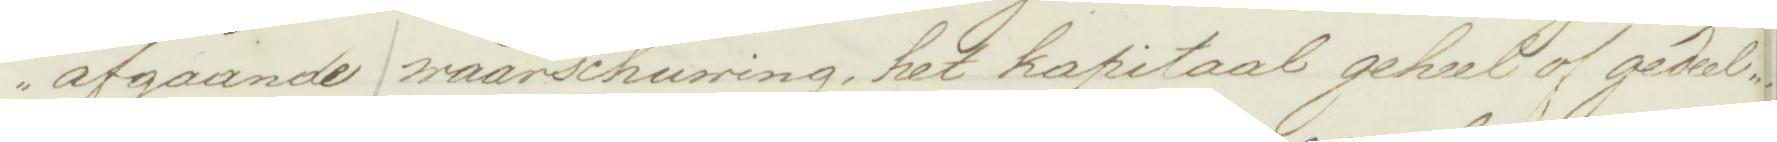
„afgaande waarschuwing, het kapitaal geheel of gedeel„
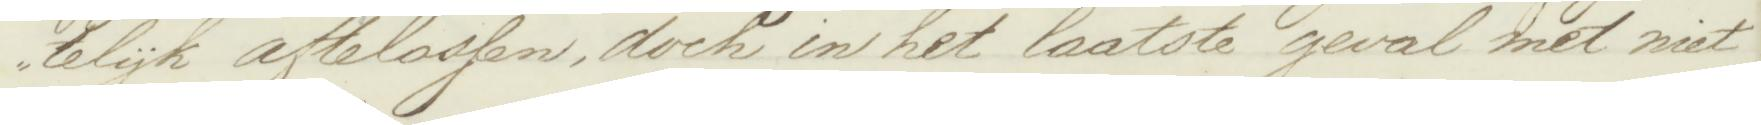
„telijk aftelossen, doch in het laatste geval met niet
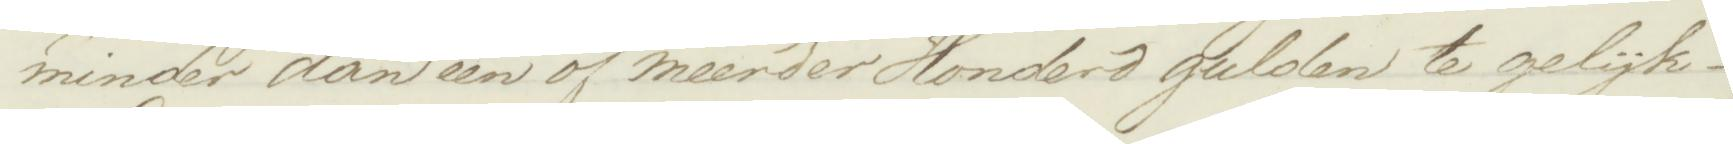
minder dan een of meerder Honderd gulden te gelijk —
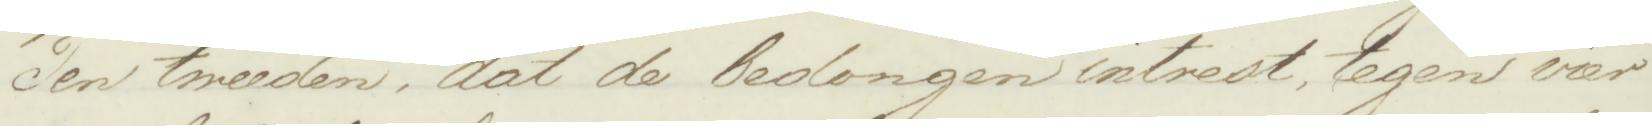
Ten tweeden, dat de bedongen intrest, tegen vier
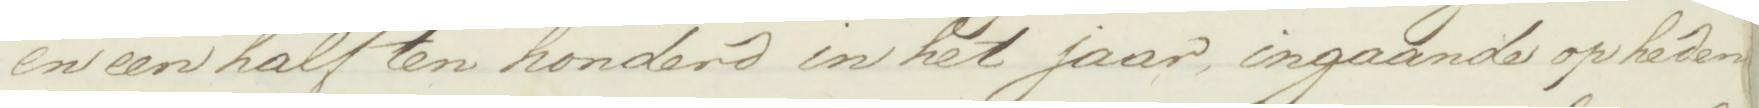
en een half ten honderd in het jaar, ingaande op heden
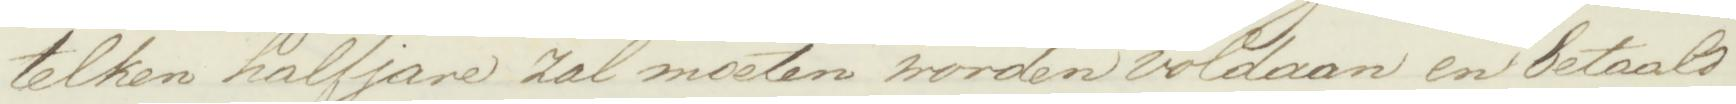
telken halfjare zal moeten worden voldaan en betaald
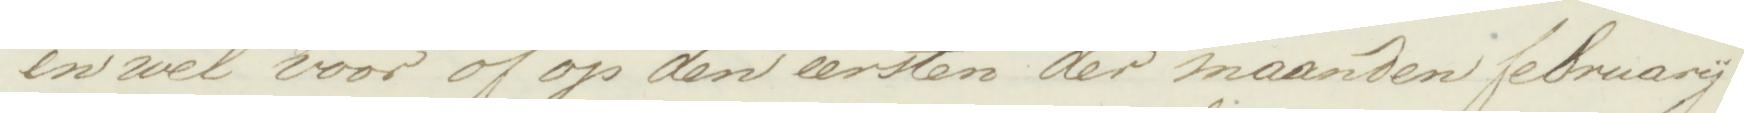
en wel vóór of op den eersten der maanden februarij
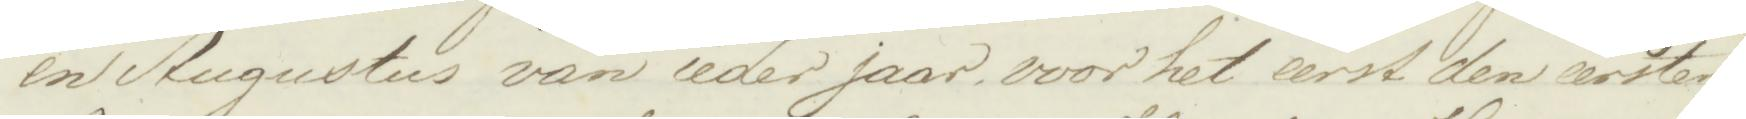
en Augustus van ieder Jaar, voor het eerst den eersten
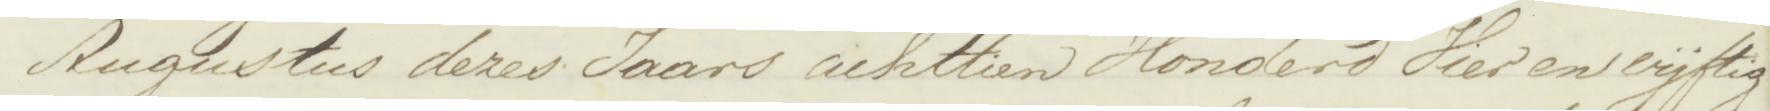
Augustus dezes Iaars achttien Honderd Vier en vijftig
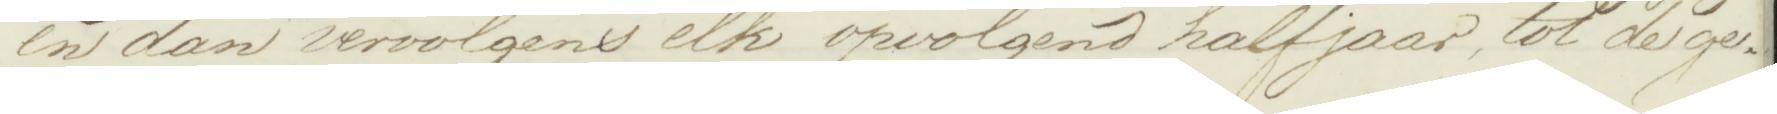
en dan vervolgens elk opvolgend halfjaar, tot de ge„
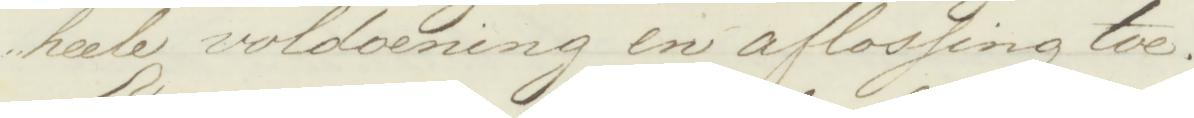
heele voldoening en aflossing toe.
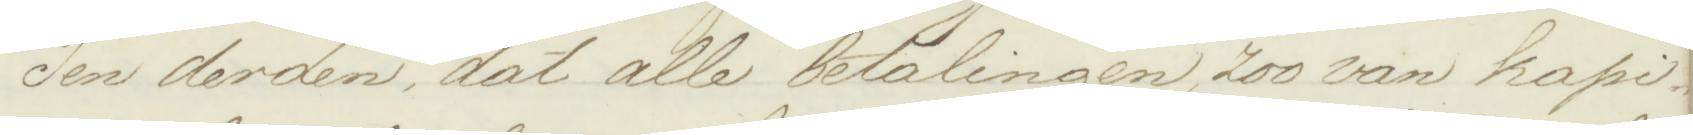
Ten derden, dat alle betalingen, zoo van kapi„
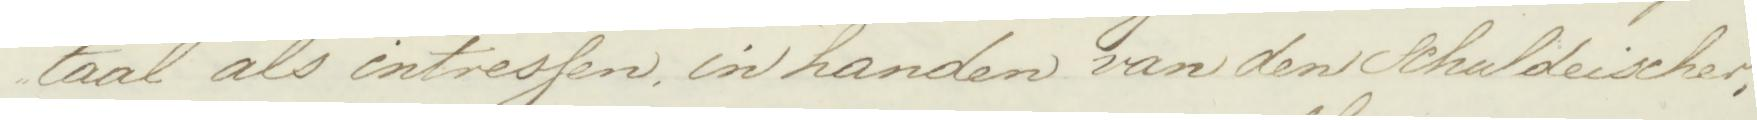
„taal als intressen, in handen van den schuldeischer,
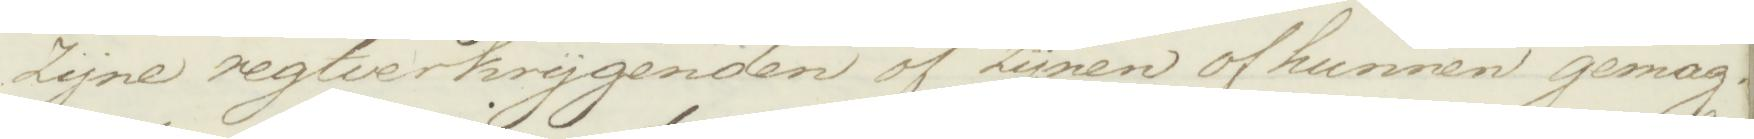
zijne regtverkrijgenden of zijnen of hunnen gemag„
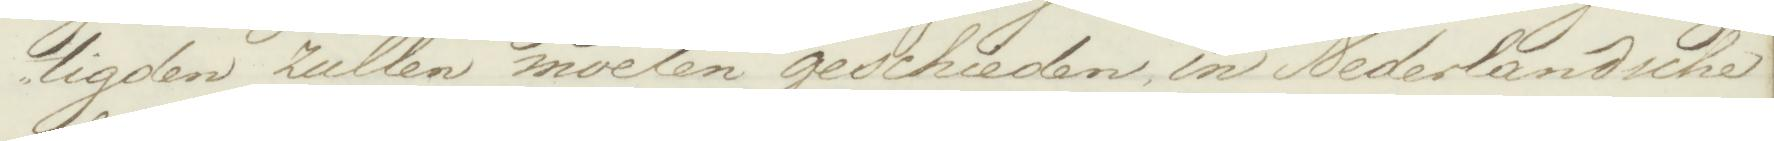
„tigden zullen moeten geschieden, in Nederlandsche
